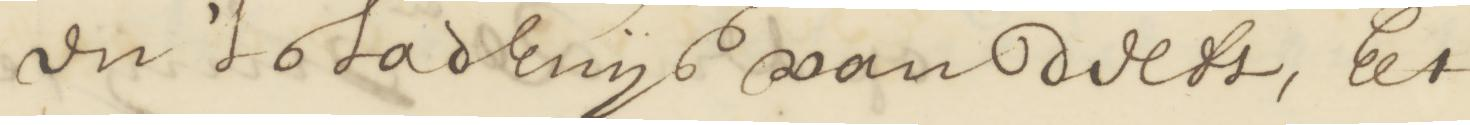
en 't stadhuijs van delft, het
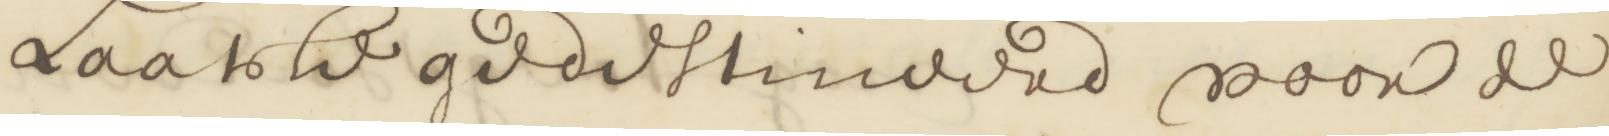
Laatse gedestineerd voor de
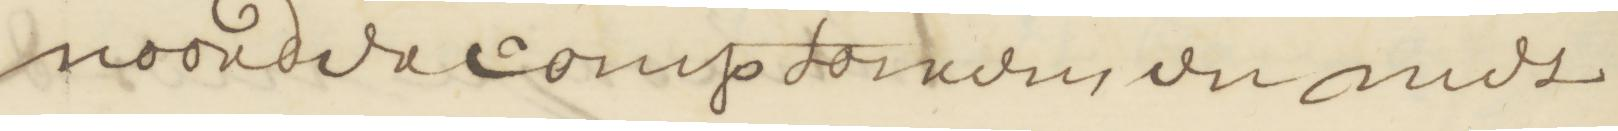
noorder comptoirem, en met
